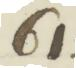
61.
